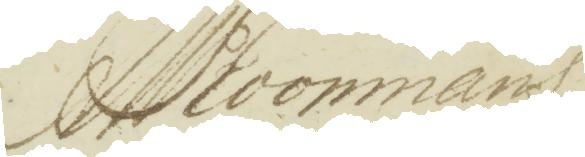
AMKoopmans
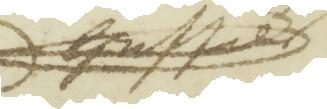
Griffier
